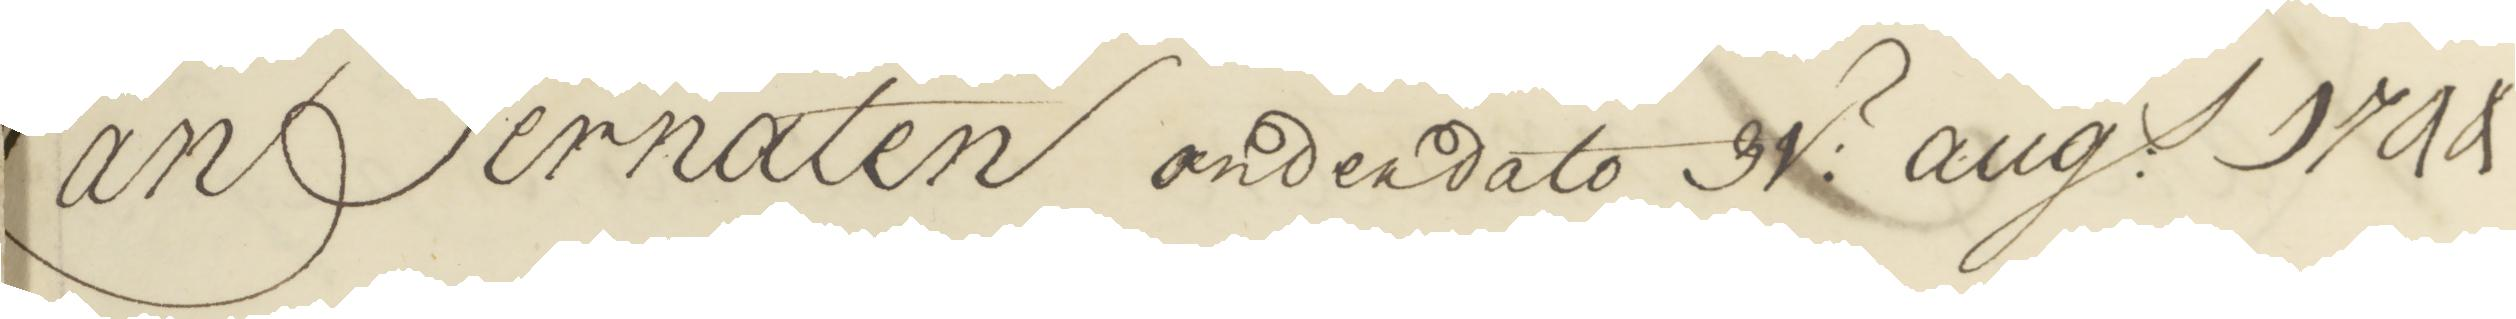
Van Ternaten onder dato 31:' aug:s 1744
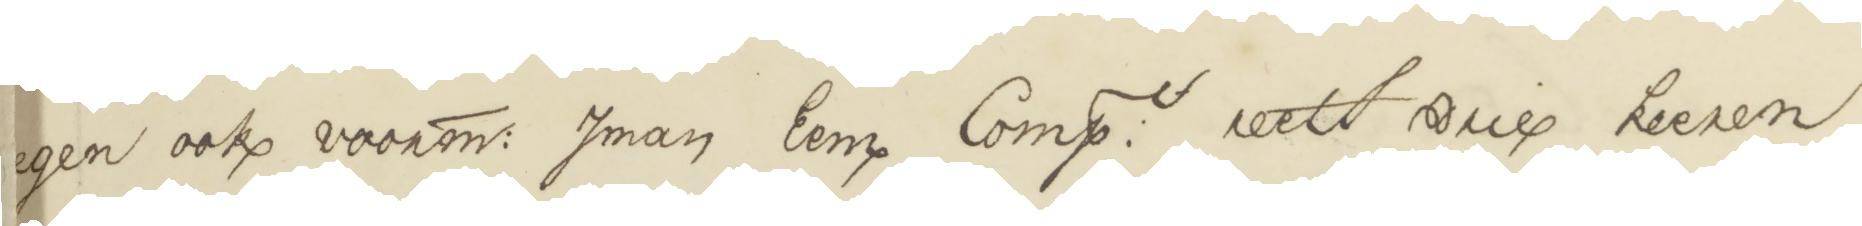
egen ook voorm: Jman hem Comp:s reets drie keeren
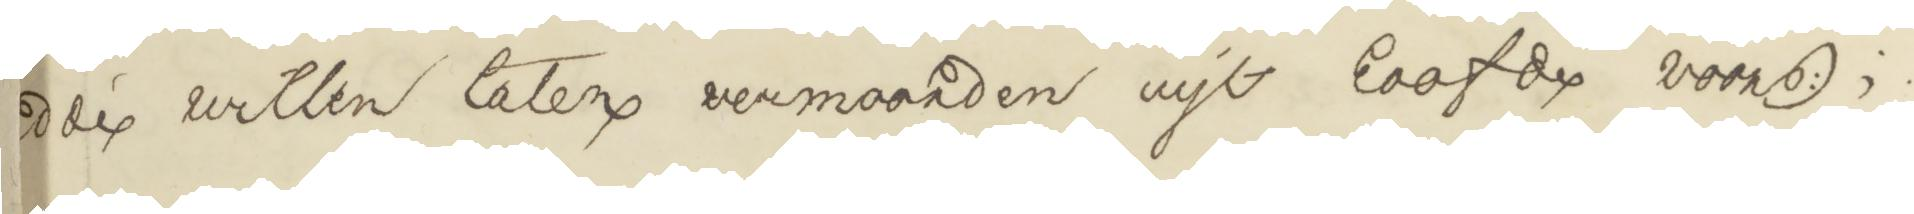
dde willen laten vermoorden uijt hoofde voors: ;
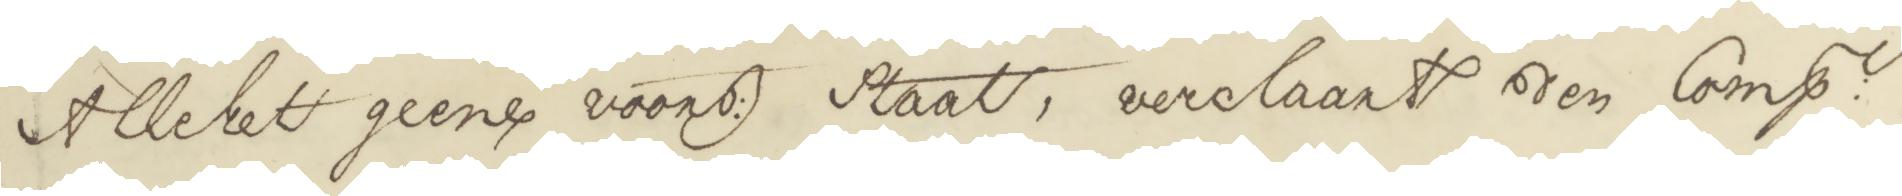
Alle het geene voors: staat, verclaart den Comp:s
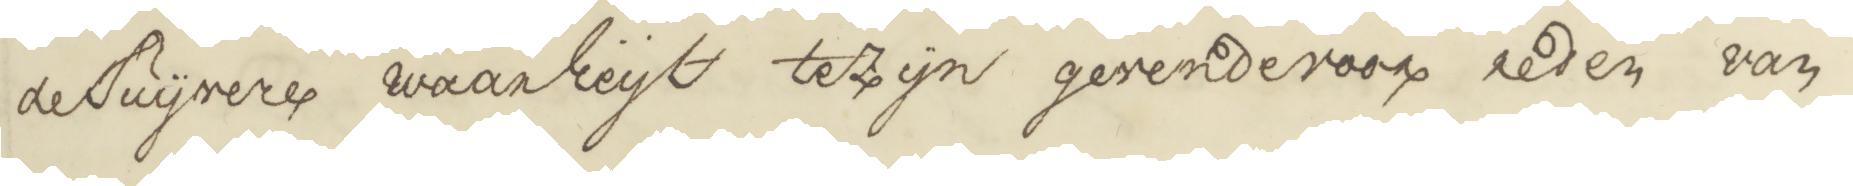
de suijvere waarheijt te zijn gevende voor reden van
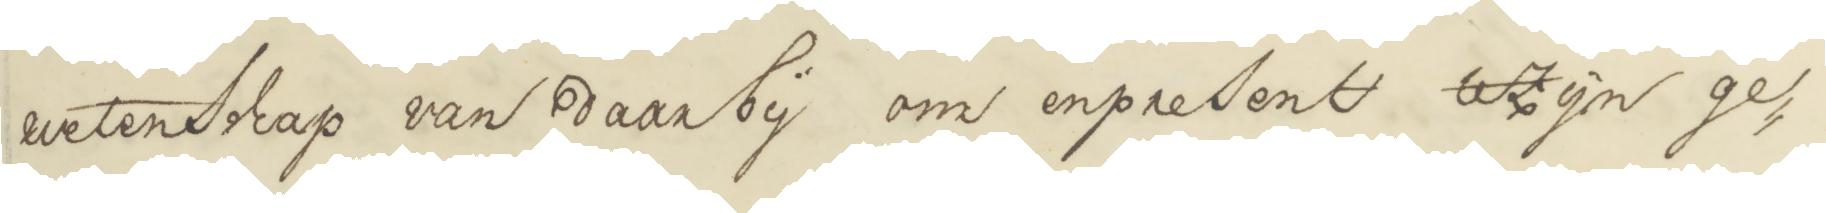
wetenschap van daarbij om enpresent tezijn ge„
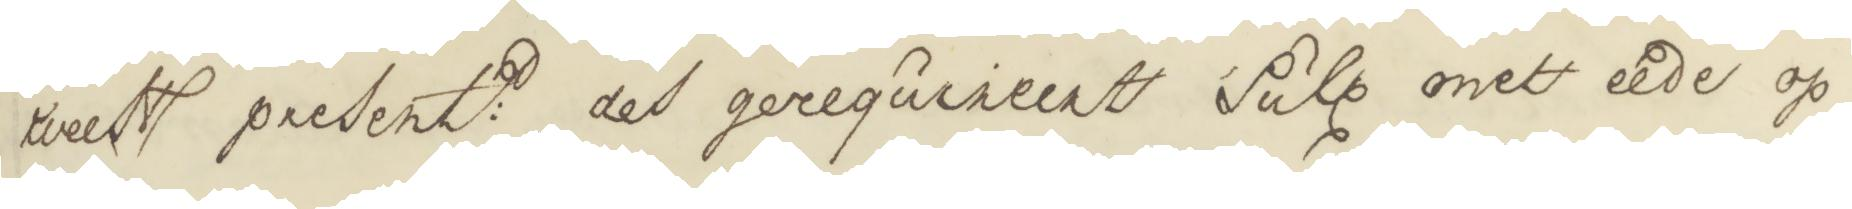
weest present:d des gerequireert sulx met eede op
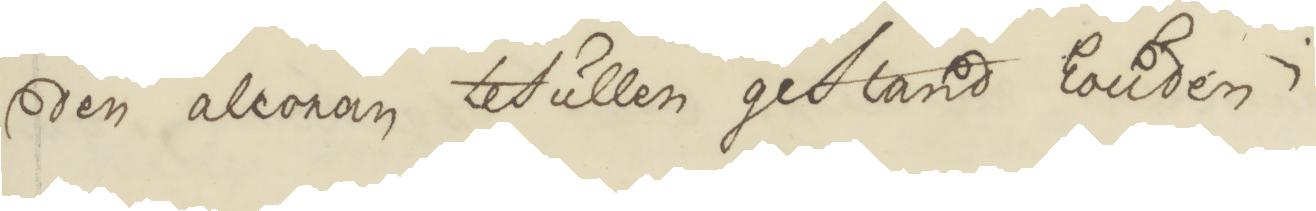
den alcoran te sullen gestand houden;
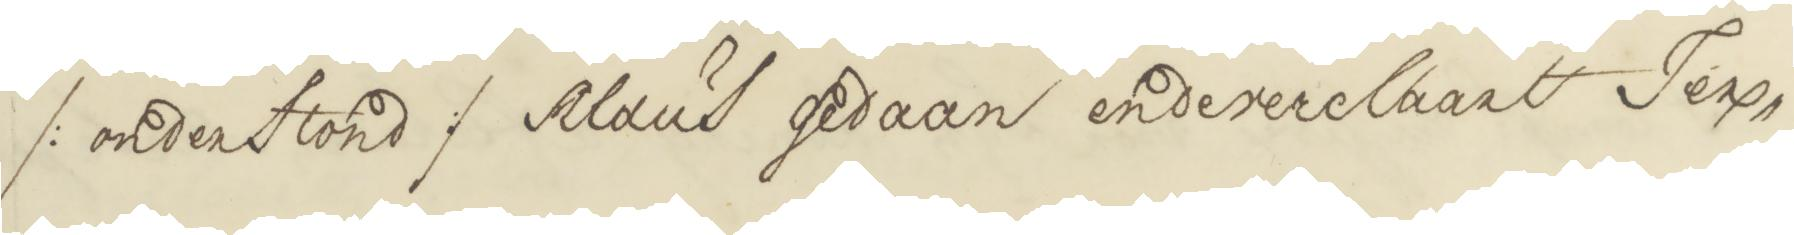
/:onderstond :/ Aldus gedaan en de verclaart Ter„
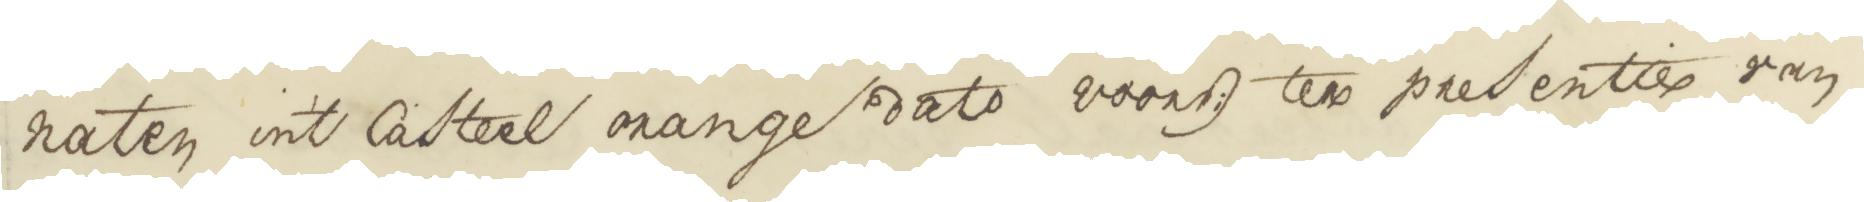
naten in’t Casteel orange dato voors: ter presentie van
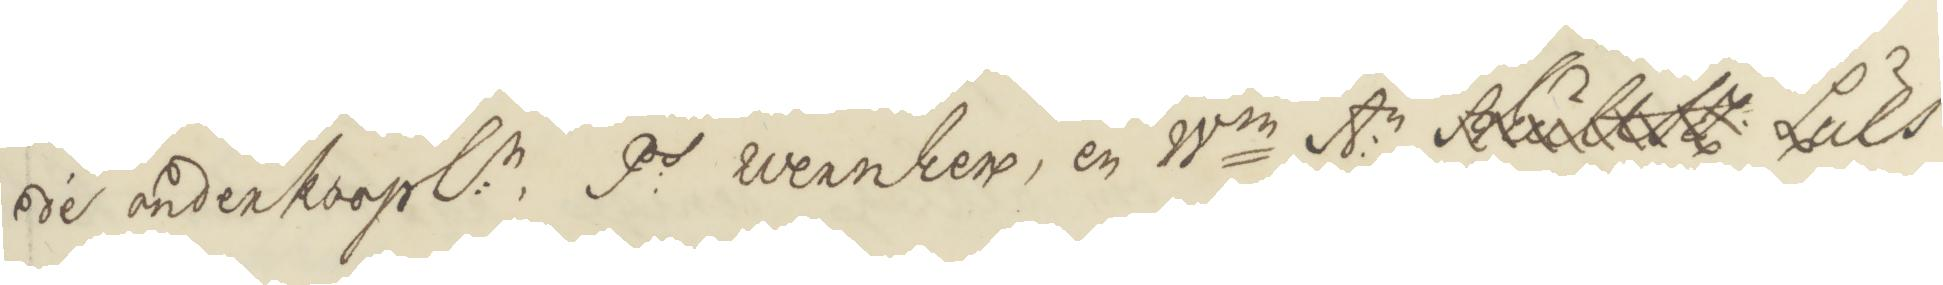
de onderkoopl:n, P:s wernher, en W=m A:n Alustsz: Luls
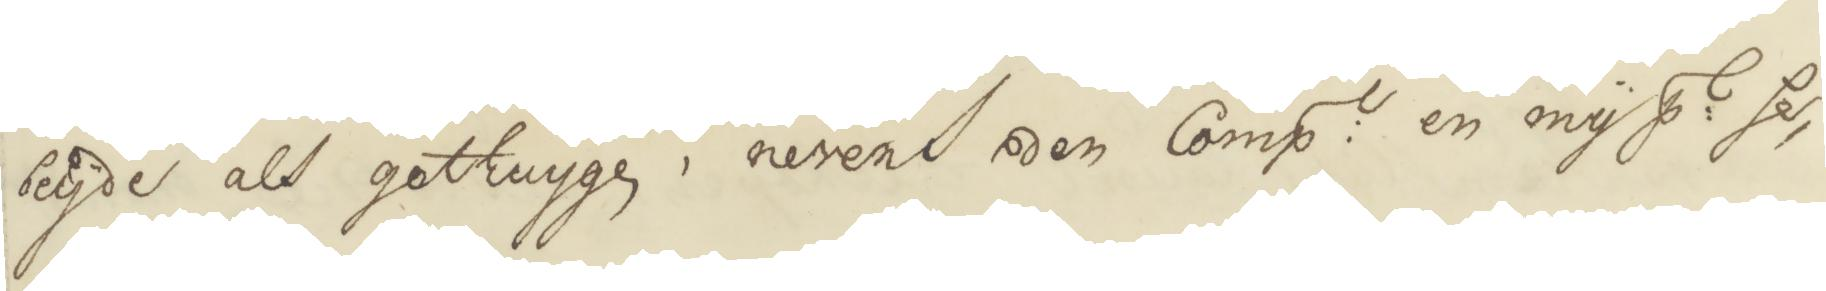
beijde als gethuijgen, nevens den Comp:s en mij p:l se„
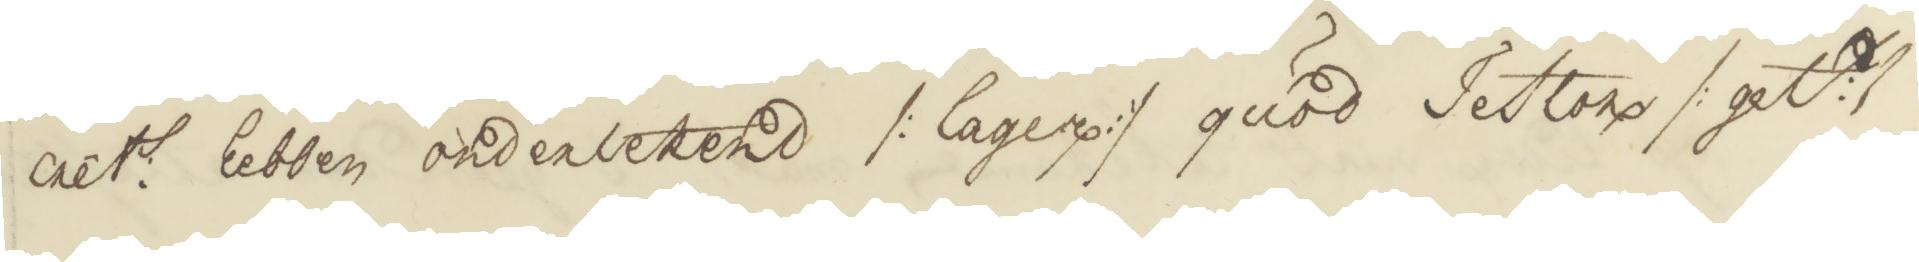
cret:s hebben ondertekend /:lager:/ quod Testor /:get:d/
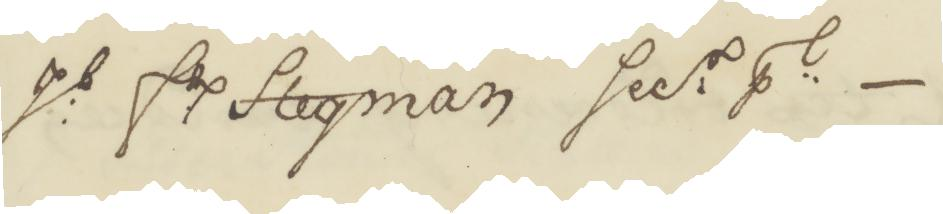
J:b f„k Stegman sec:t p:l —
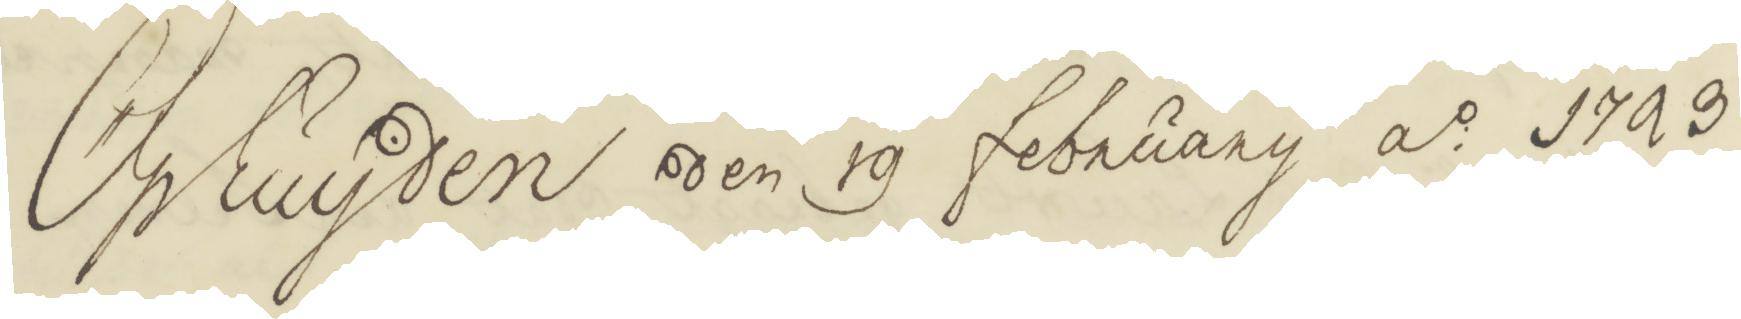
Op huijden den 19 februarij a:o 1743
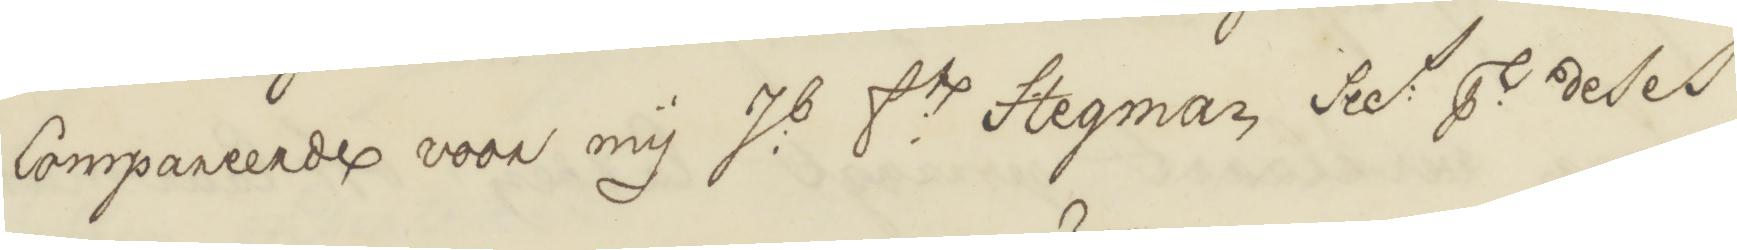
Compareerde voor mij J:b f„k Stegman Sec:s p:l deses
